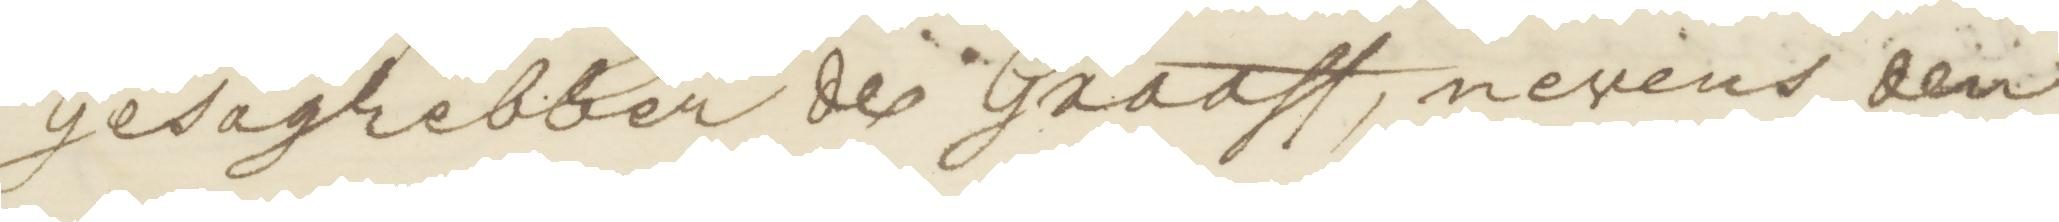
Gesaghebber de Graaff, nevens den
